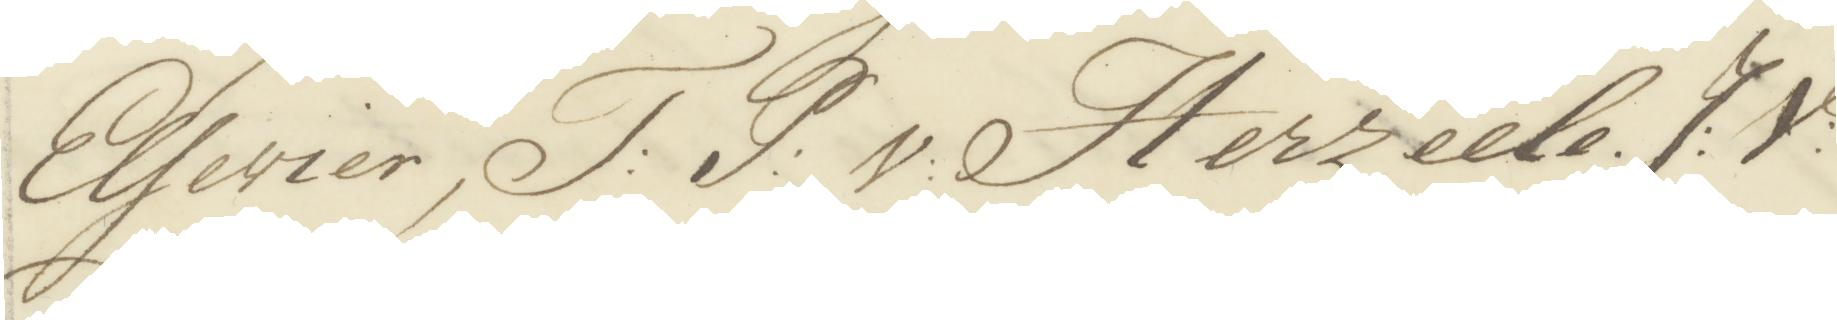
Elsevier, T: P: v: Herzeele. J: V:
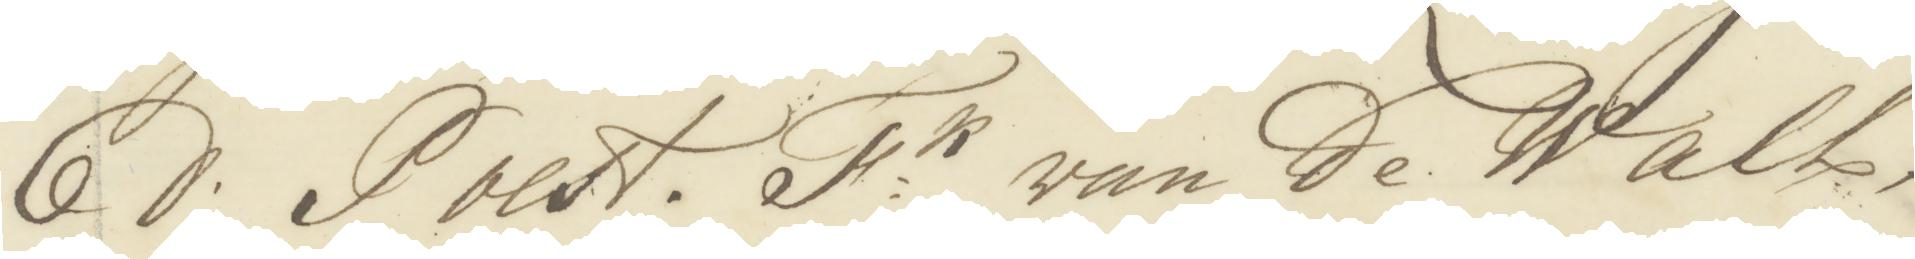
d: Poest. F:k van de Wall,
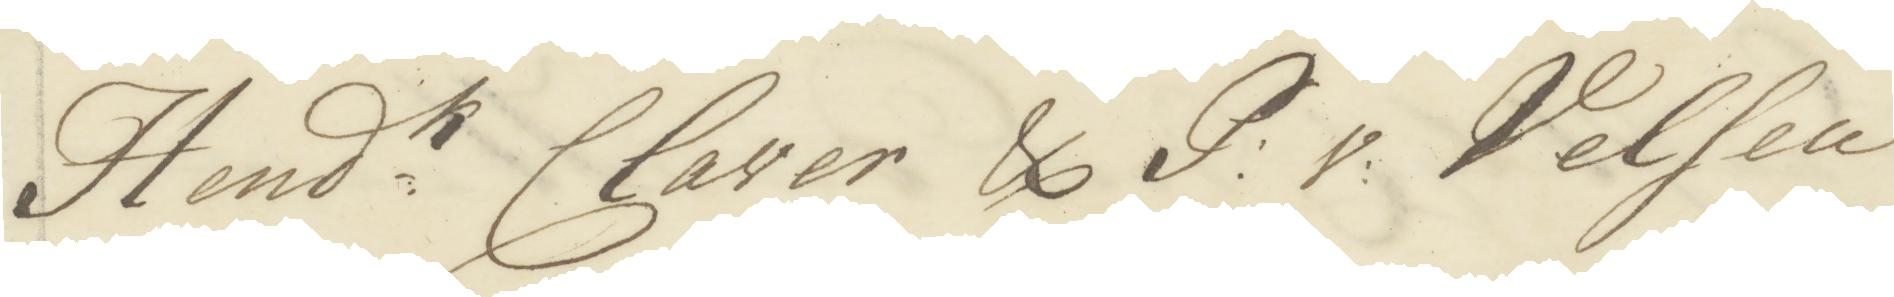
Hend:k Claver & P: v: Velsen
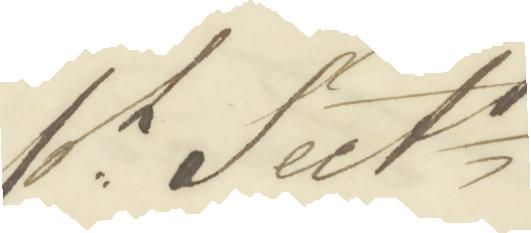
p„r sect=t
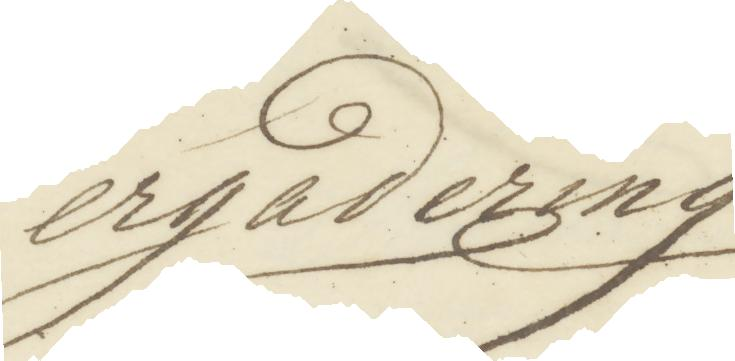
Vergadering
